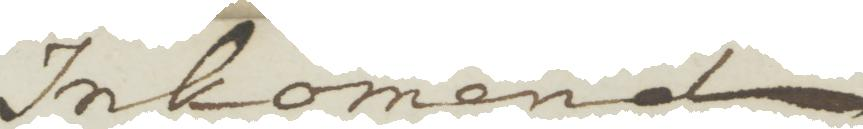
Jnkomend
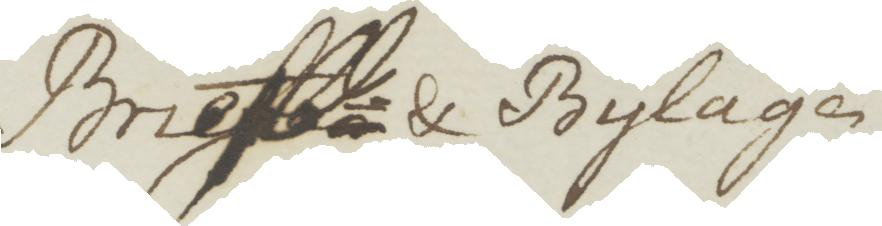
Briefb=l & Bylage
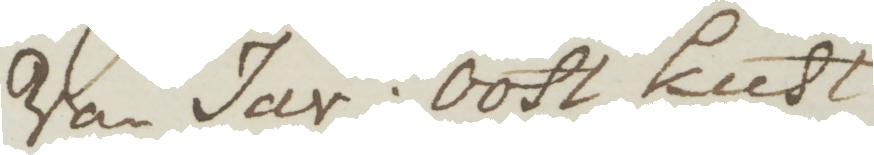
Van Iav.s Oost kust
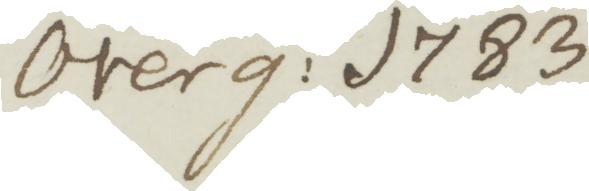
Overg:' 1783
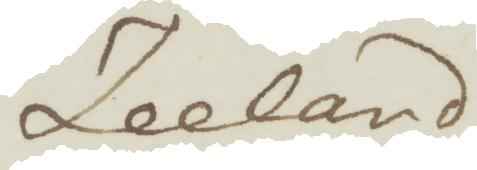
Zeeland
